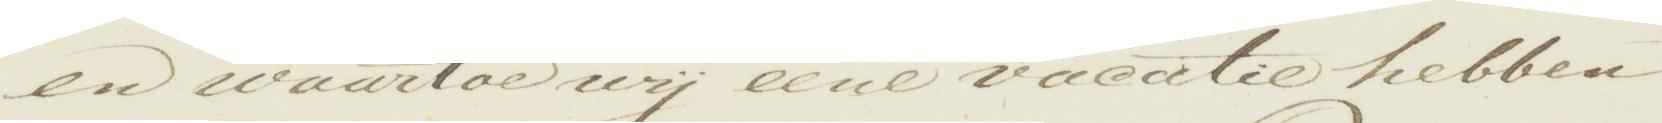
en waartoe wij ééne vacatie hebben
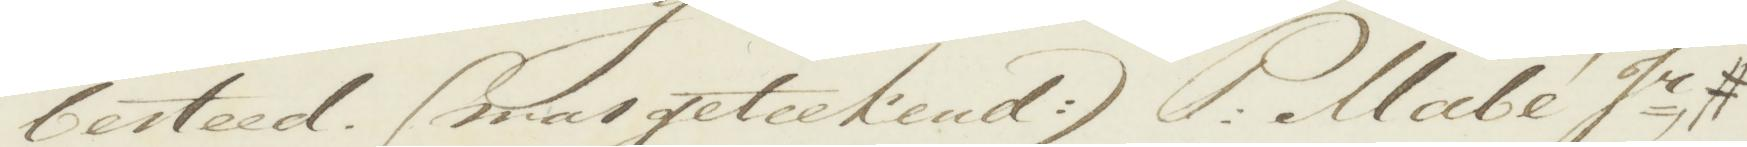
besteed. (was geteekend:) P. Mabé J=r #
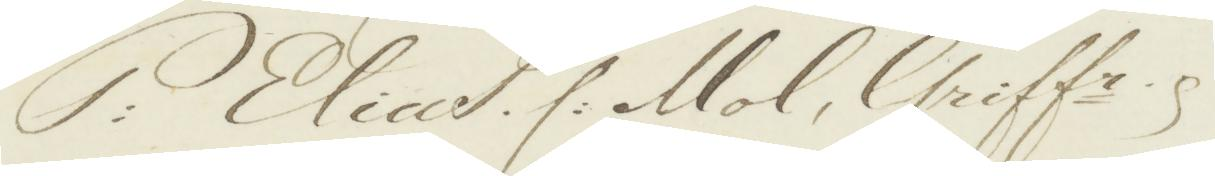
P: Elias. C: Mol, Griffr.
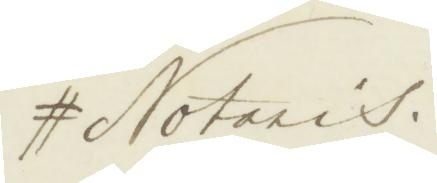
# Notaris.
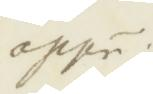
appr
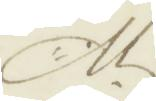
CM
